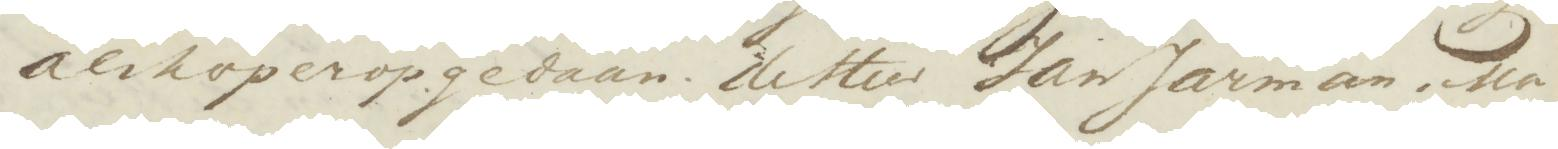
als koper op gedaan. de Heer Jan Jarman, ma
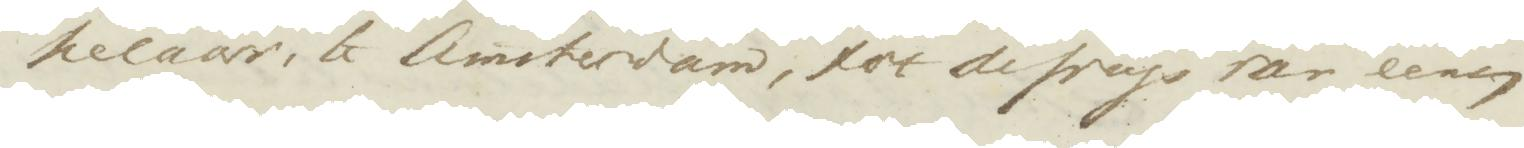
kelaar, te Amsterdam, tot de prijs van eenen
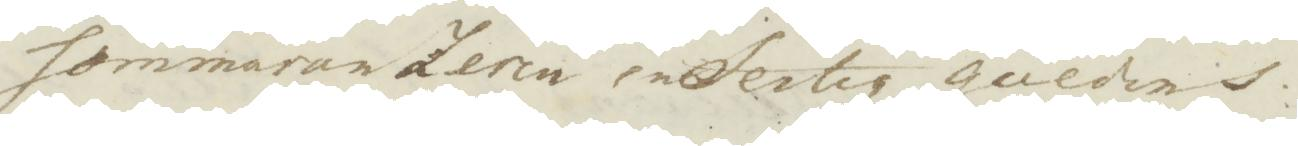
somma van Zeven en Sestig guldens.
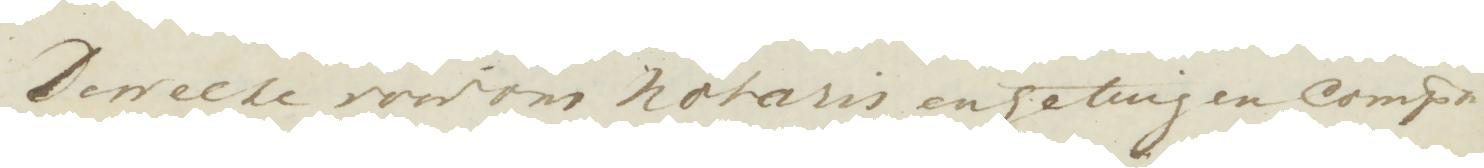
Dewelke voor ons Notaris en getuigen Compa
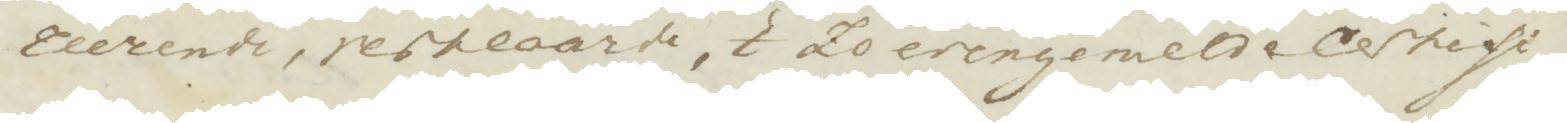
reerende, verklaarde, ’t zo evengemelde Certifi
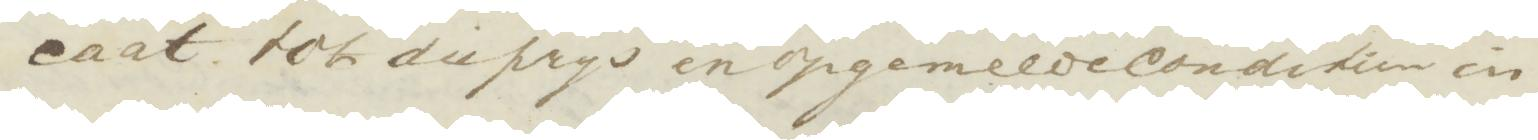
caat tot die prys en opgemelde conditien in
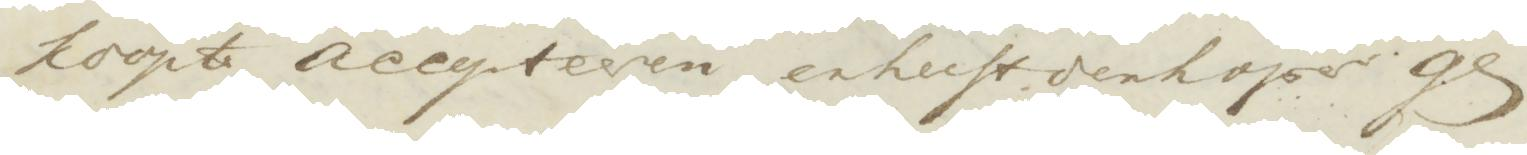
koop te accepteeren, en heeft der kope ge
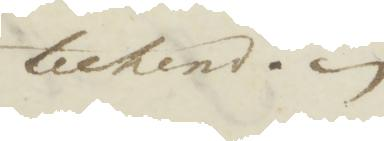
teekend.⁓
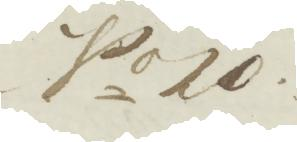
N=o 20.
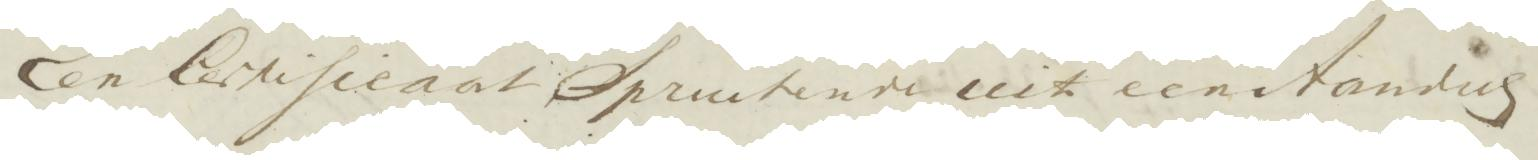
Een Certificaat spruitende uit een Aandeel
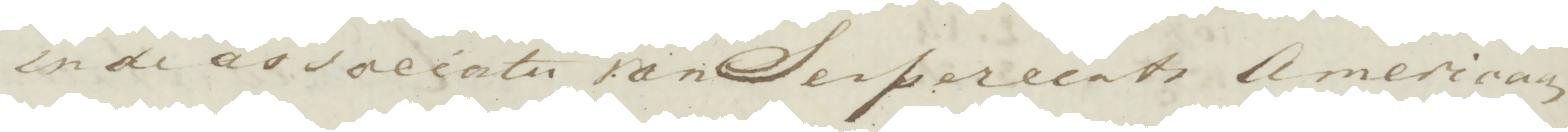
in de associatie van Ses percents Americaan
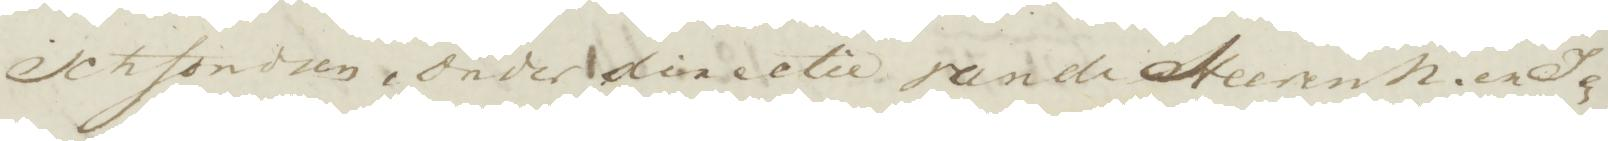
Sch fondsen, onder directie van de Heeren N. en J en
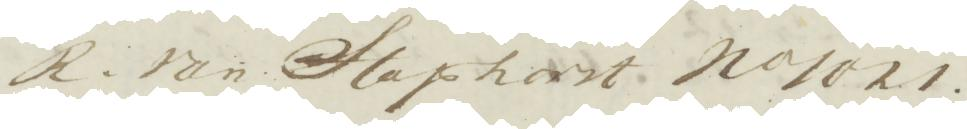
R. van Staphorst No 1021.
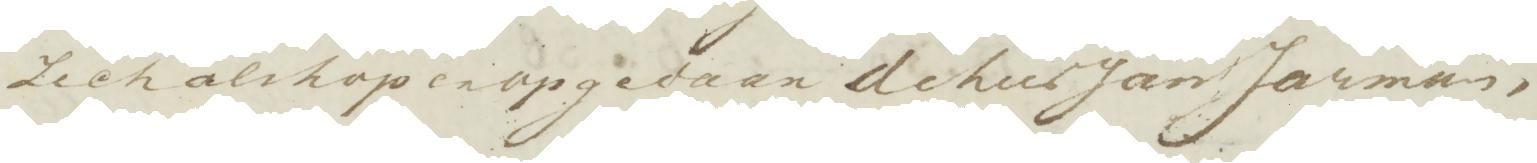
zich als hop en opgedaan de heer Jan Jarman,
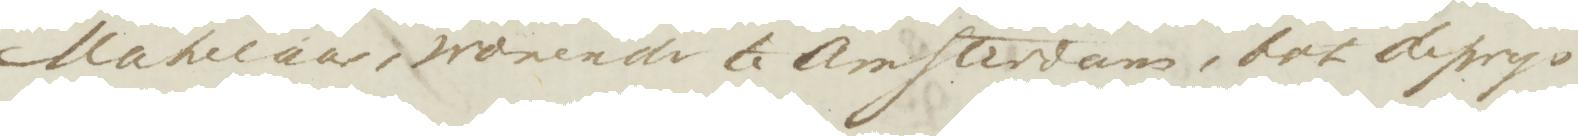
Makelaar, wonende te Amsterdan, tot de prys
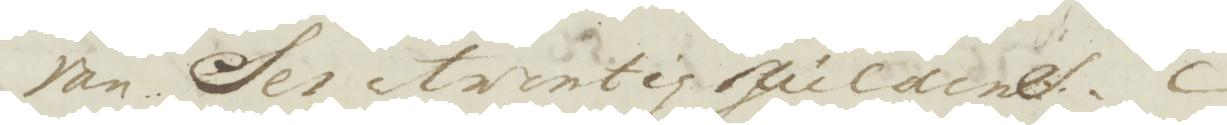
van Ses twintig Guldens.
